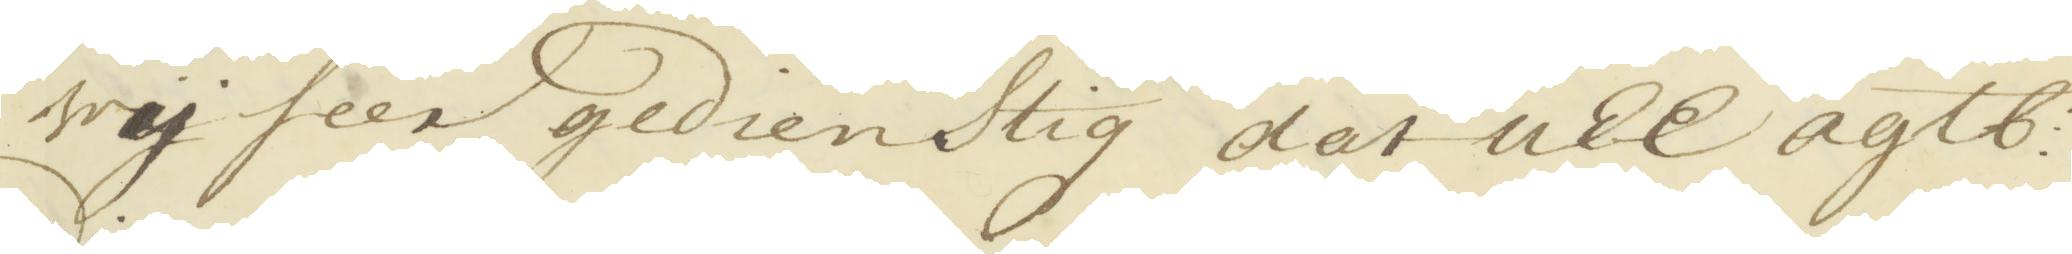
wij seer gedienstig dat uEE agtb:r
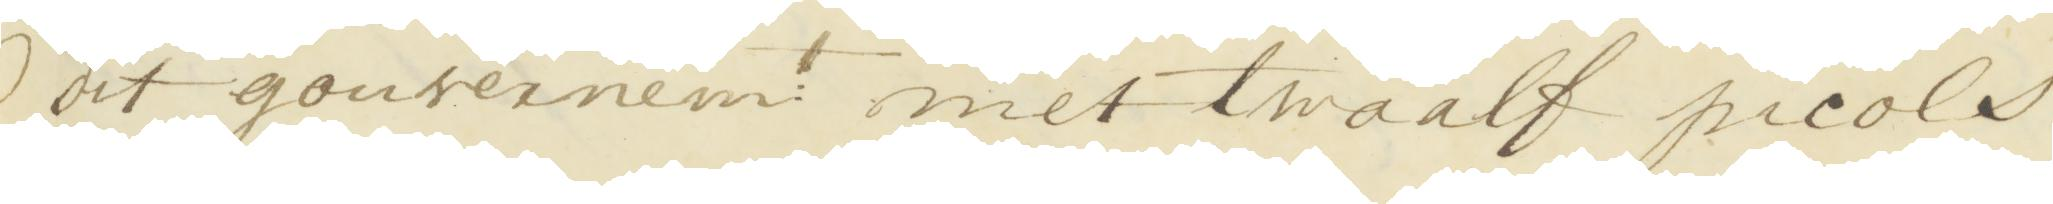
dit gouvernem:t met twaalf picols
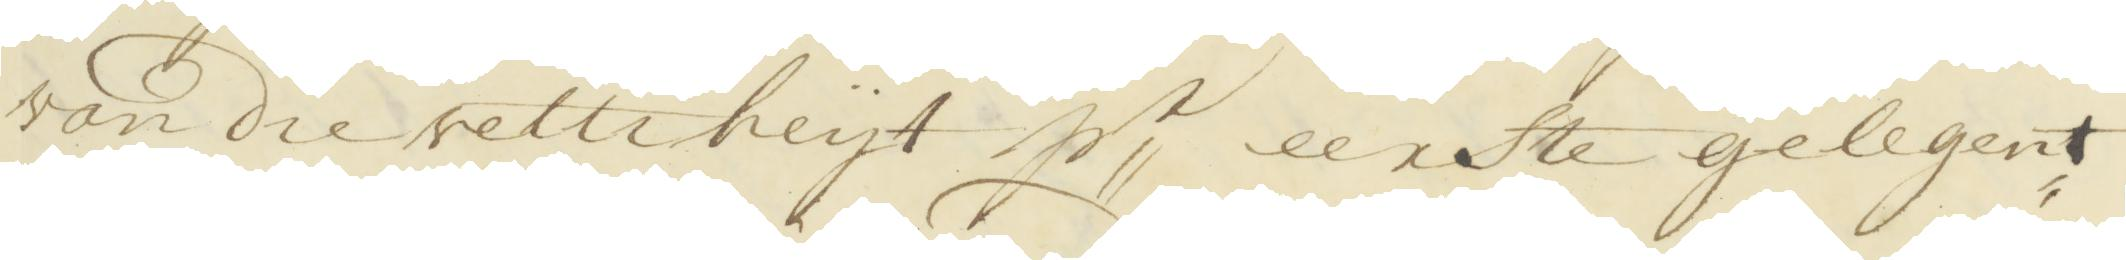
van die vettiheijt p„r eerste gelegent„
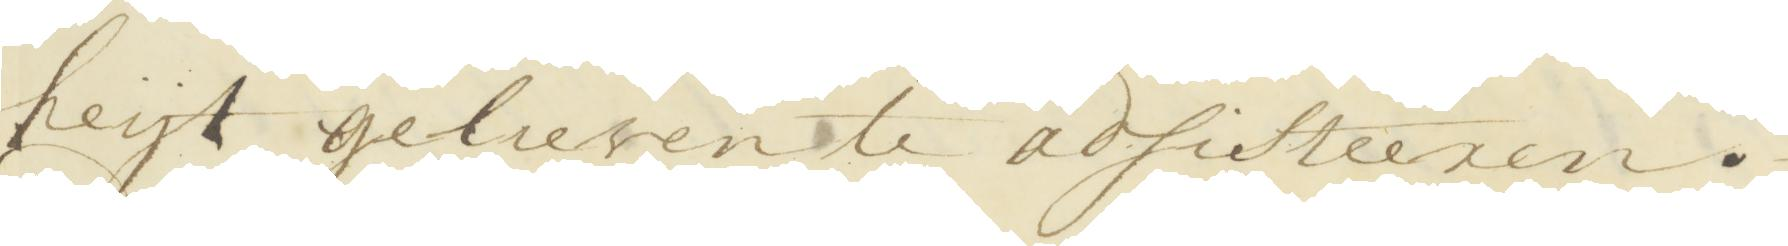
heijt gelieven te adsisteeren.
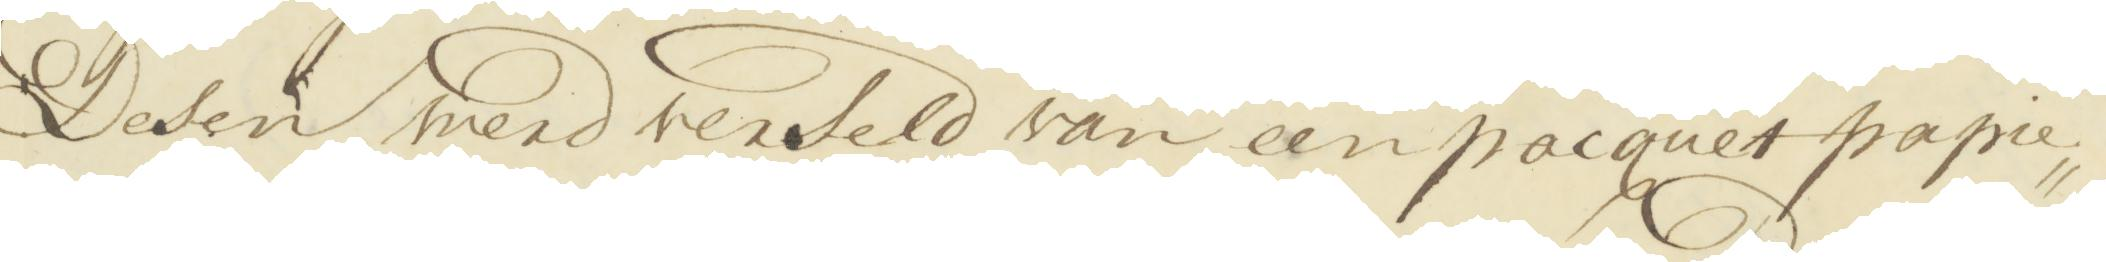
Desen werd verseld van een pacquet papie„
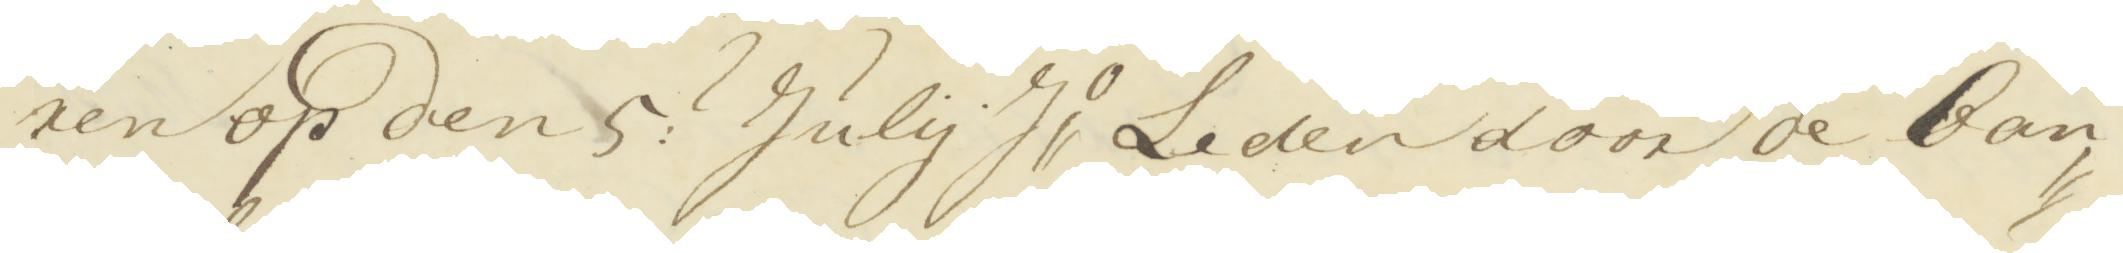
ren op den 5:' Julij J„o Leden door de ban„
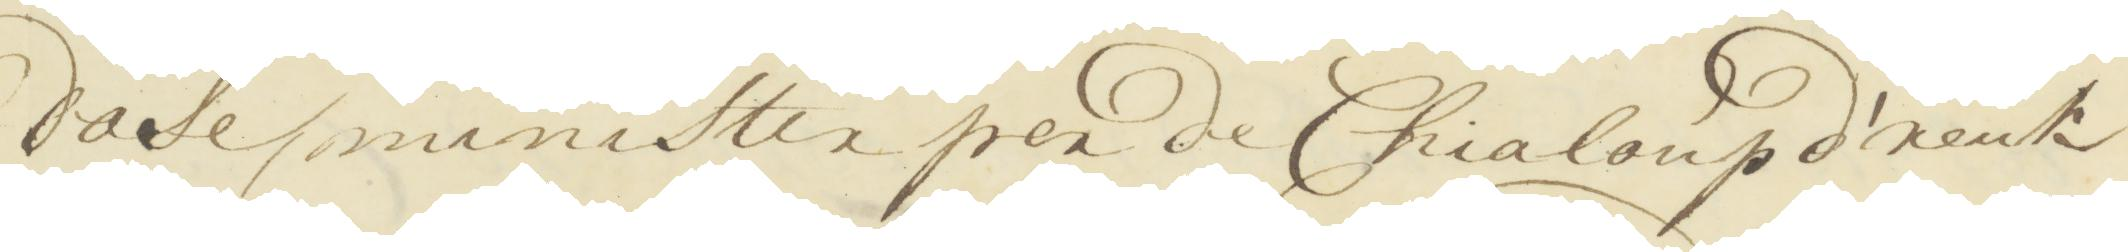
dase, minister per de Chialoup d' reuk
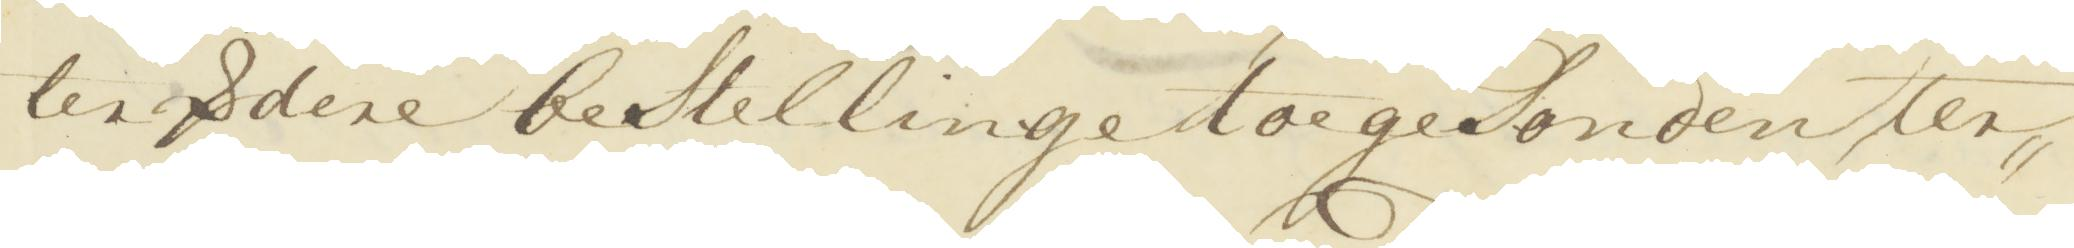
ter verdere bestellinge toe gesonden ter„
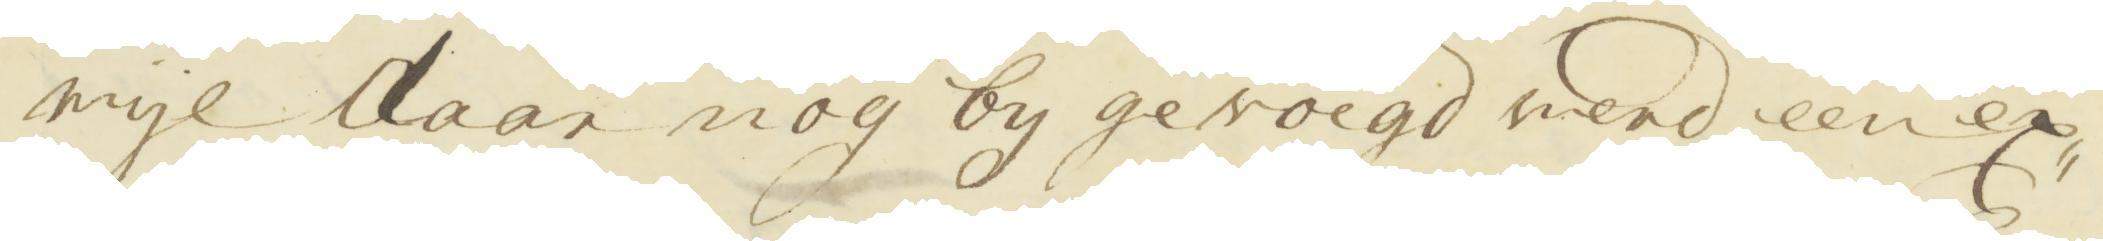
wijl daar nog by gevoegd werd een ex„
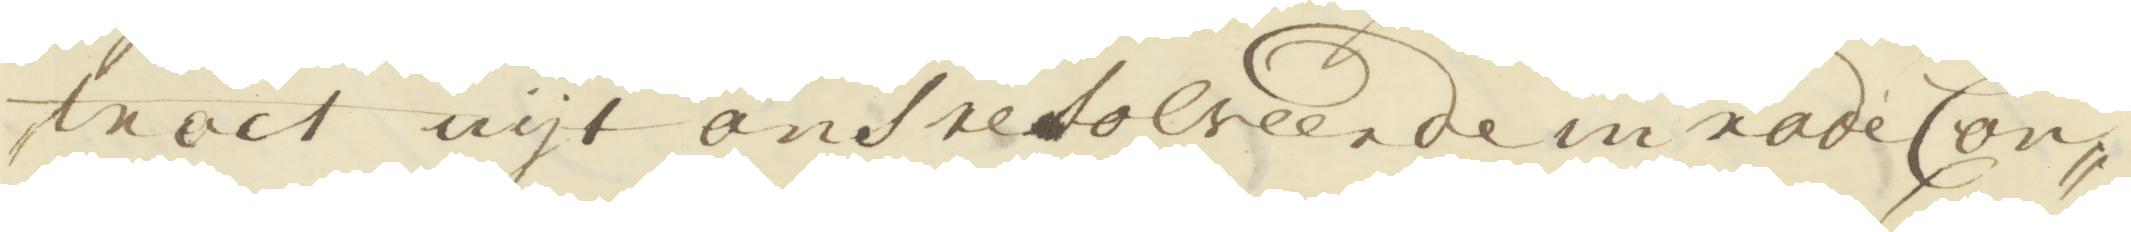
„tract uijt ons resolveerde in rade Con„
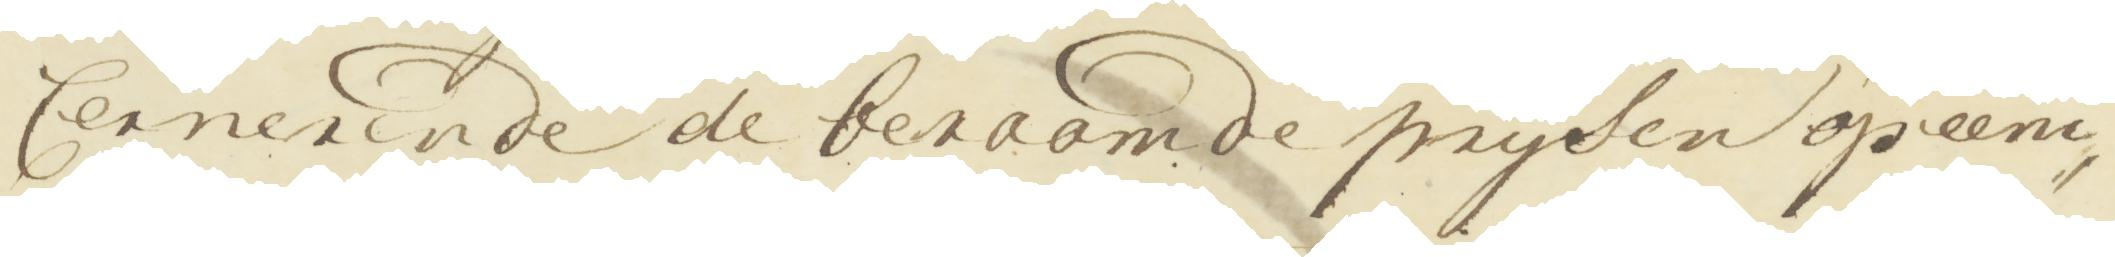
Cernerende de beraamde prijsen op eeni„
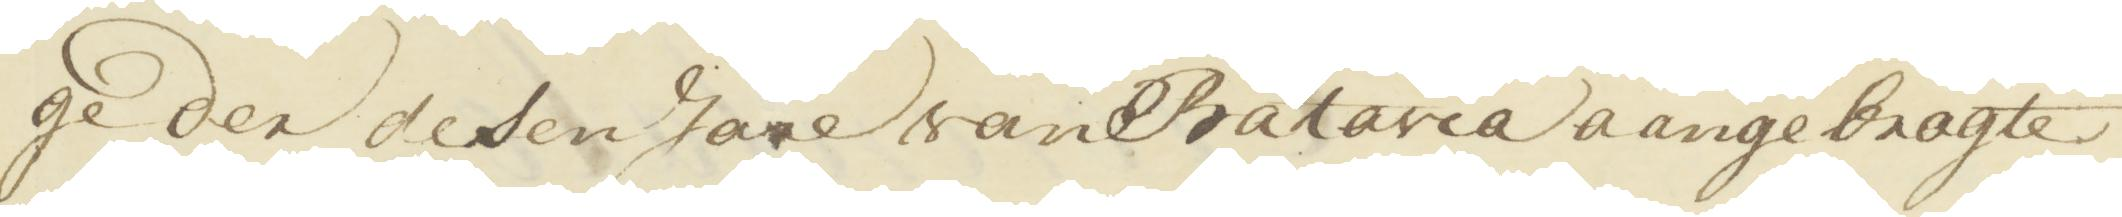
ge der desen Jare van Batavia aangebragte
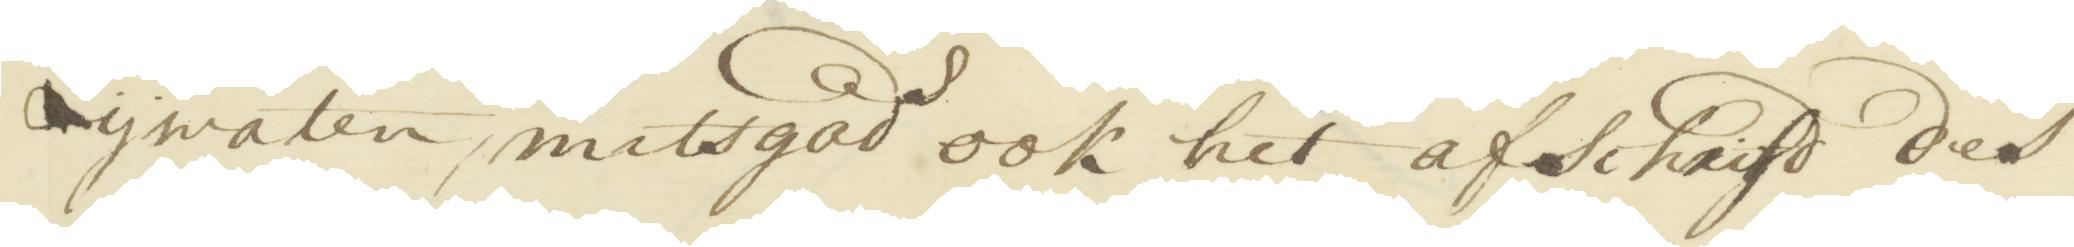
Lijwaten, mitsgad:s ook het afschrifd des
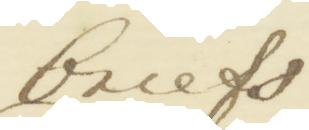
briefs
